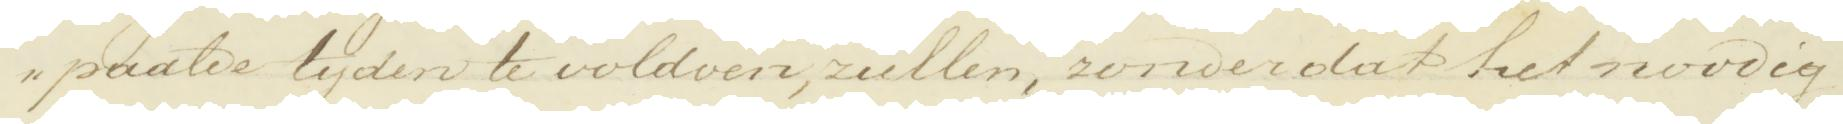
„paalde tyden te voldoen, zullen, zonder dat het noodig
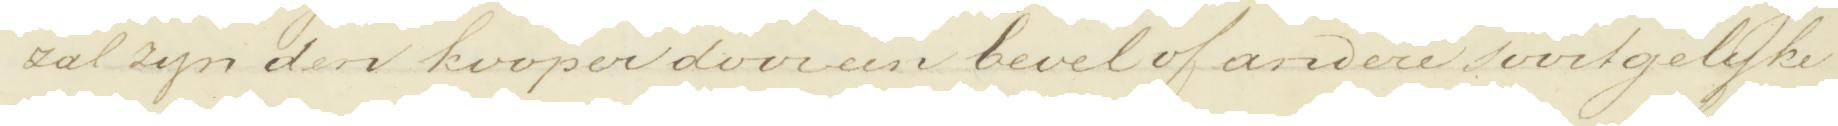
zal zyn den kooper door een bevel of andere soortgelyke
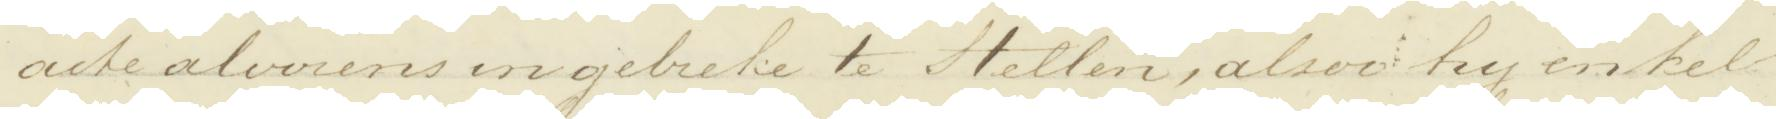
acte alvorens ingebreke te stellen, alzoo hy enkel
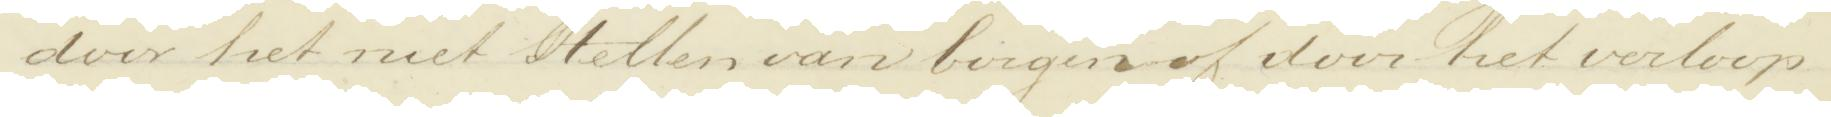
door het niet stellen van borgen of door het verloop
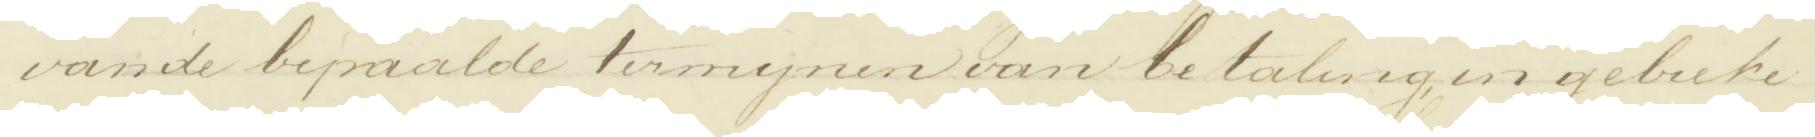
van de bepaalde termynen van betaling, in gebreke
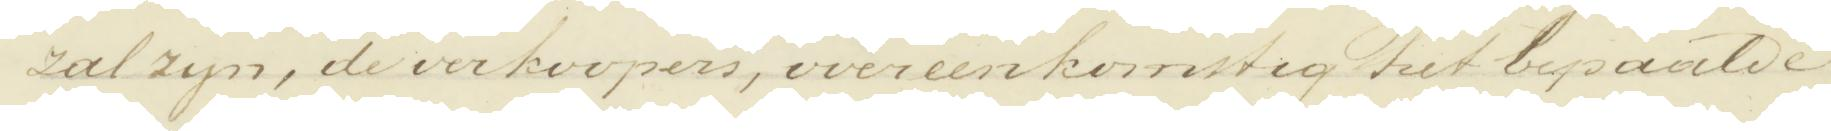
zal zyn, de verkoopers, overeenkomstig het bepaalde
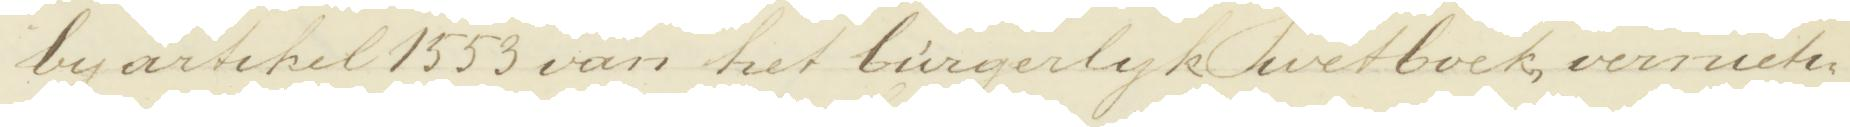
by artikel 1553 van het burgerlyk wetboek, vernieti„
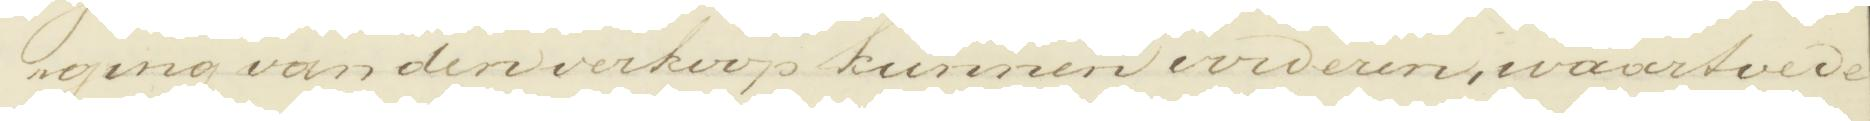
ging van den verkoop kunnen vorderen, waartoe de
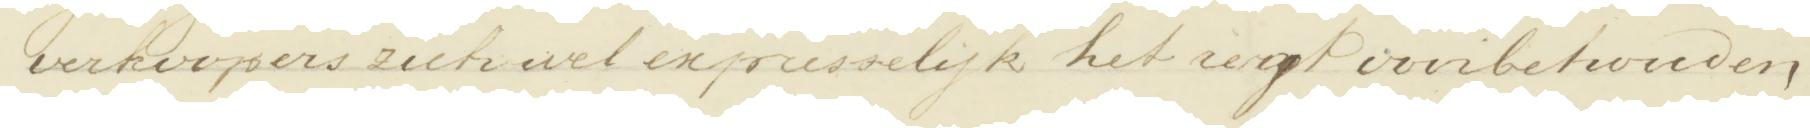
verkoopers zich wel expresselijk het regt ¶ voorbehouden
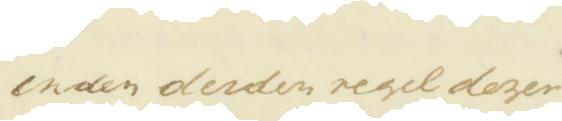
in den derden regel dezer
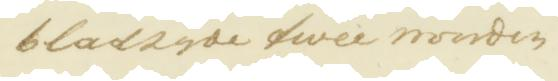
bladzyde twee woorden
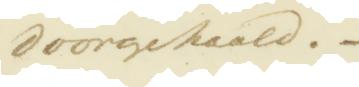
doorgehaald.-
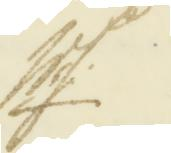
W/S.
